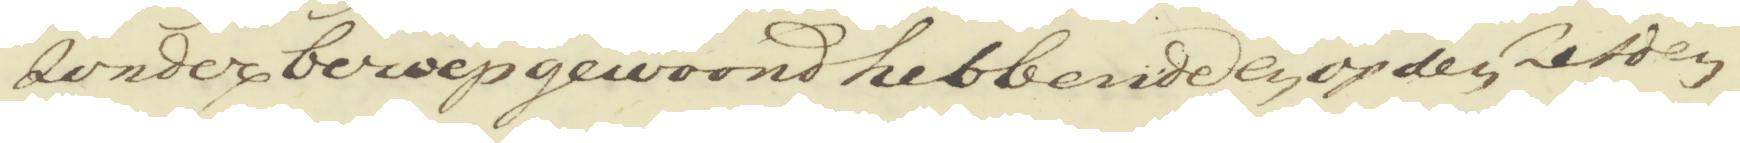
zonder beroep gewoond hebbende en op den zesden
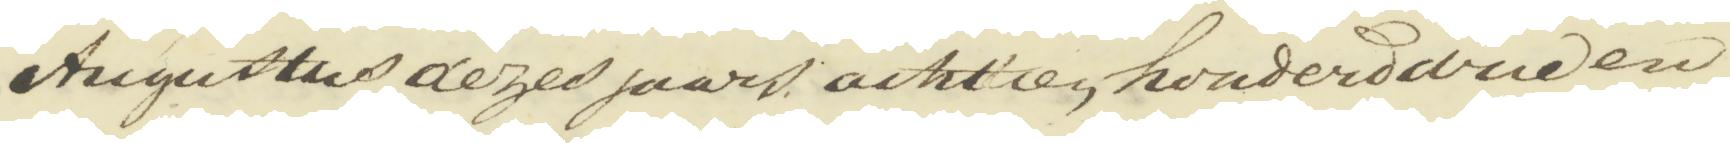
Augustus dezes jaars achtien honderd drie en
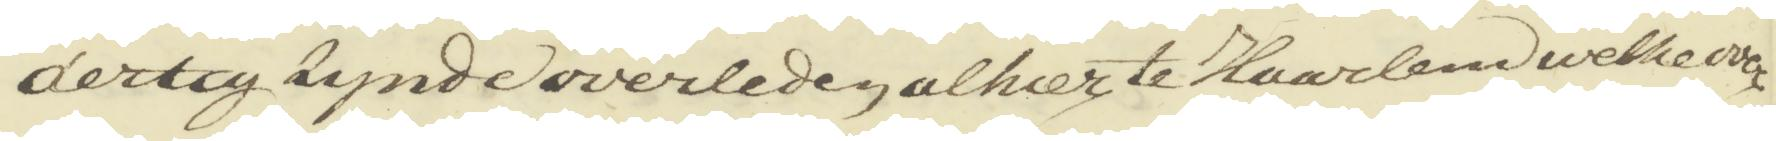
dertig zynde overleden alhier te Haarlem welke over
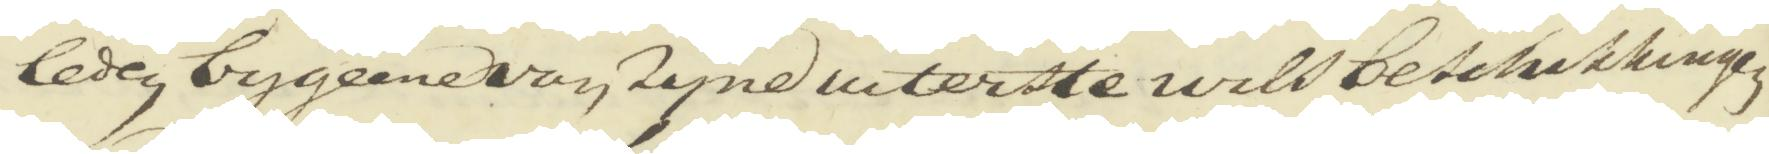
leden by geene van zyne uiterste wils beschikkingen
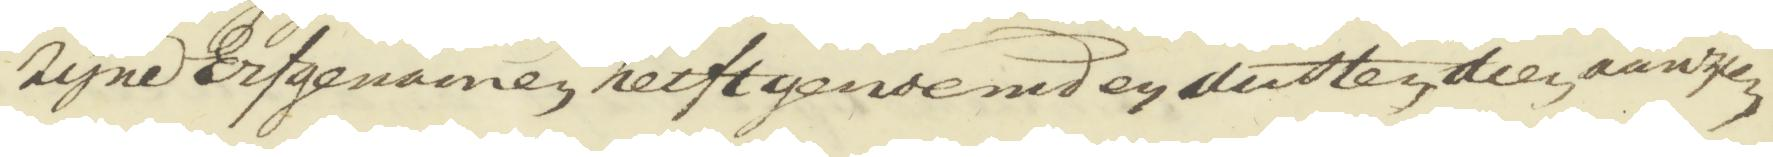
zyne Erfgenamen heeft genoemd en dus ten dien aanzien
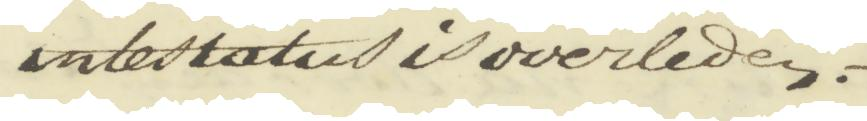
intestatus is overleden. —
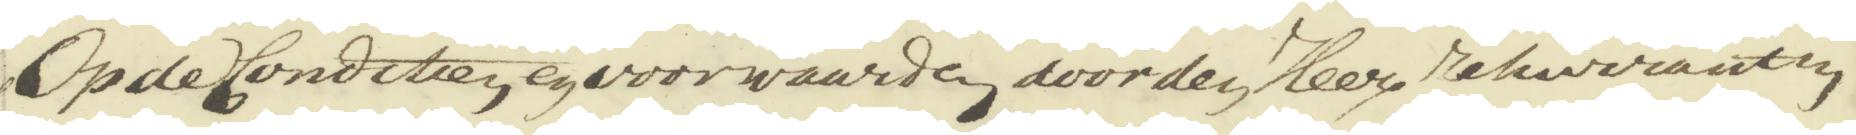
Op de Conditien en voorwaarden door den Heer rekurranten
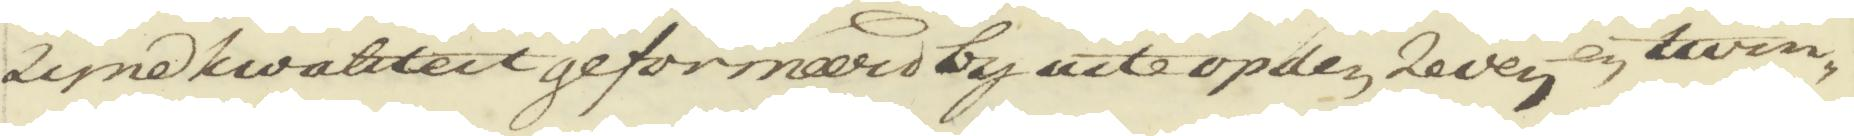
zyne kwaliteit geformeerd by acte op den zeven en twin„
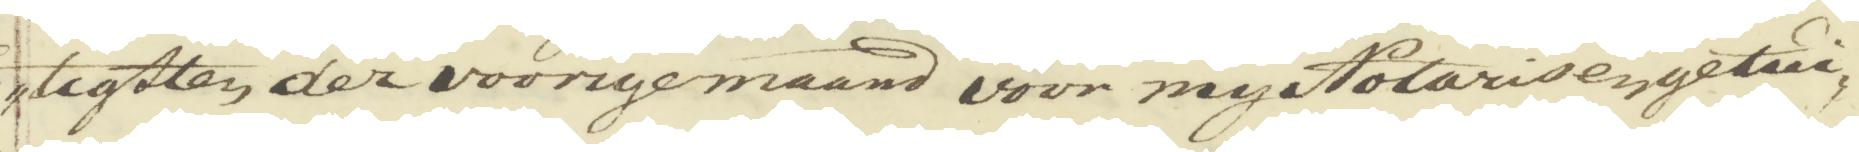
„tigsten der voorige maand voor my Notaris en getui„
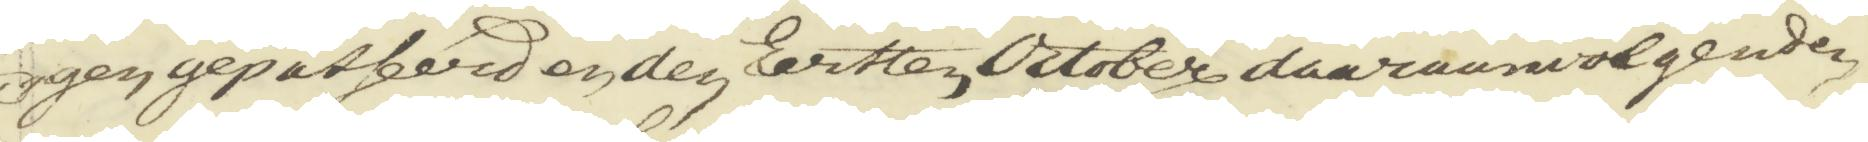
gen gepasseerd en den Eersten October daaraan volgenden
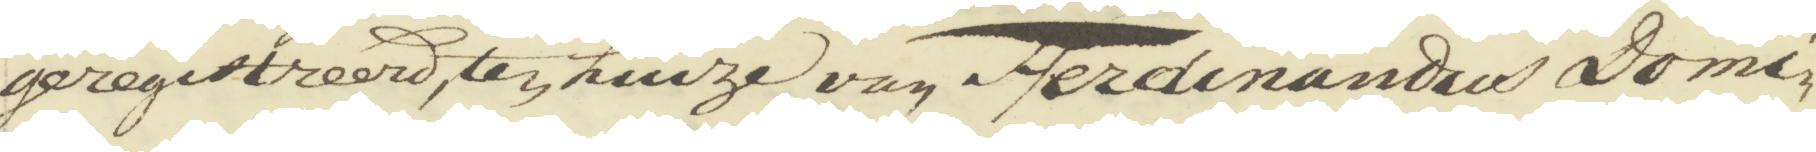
geregistreerd, ten huize van Herdinandus Domi„
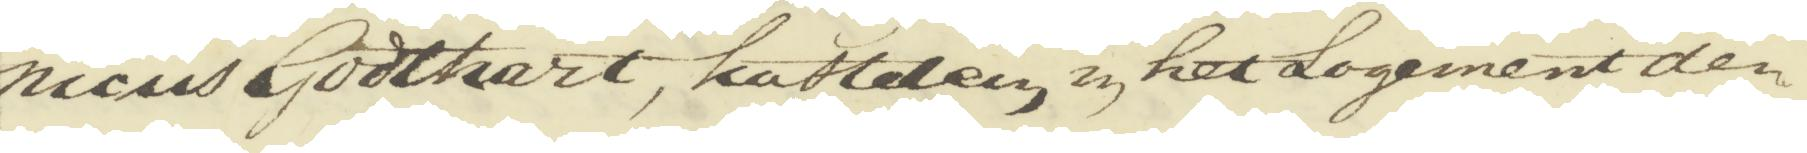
nicus Godthart, kastelein in het Logement den
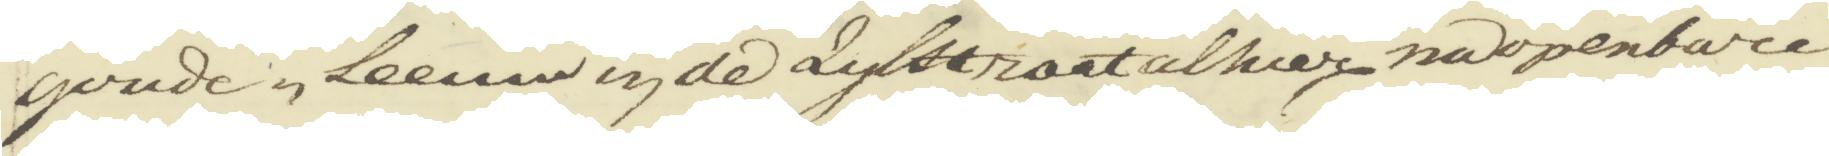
gouden leeuw in de Zylstraat alhier na openbare
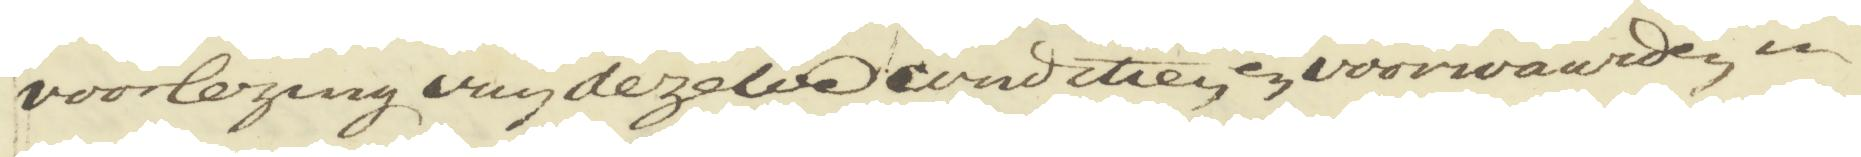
voorlezing van dezelve conditien en voorwaarden in
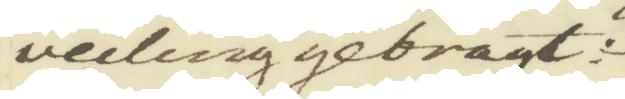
veiling gebragt: —
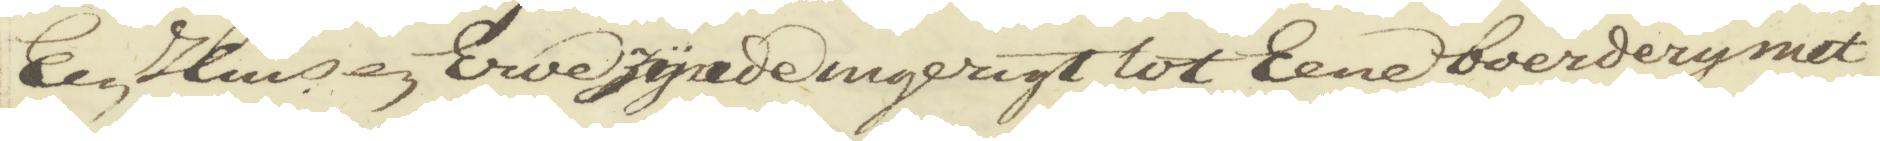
Een Huis en Erve zijnde ingerigt tot Eene boerdery met
